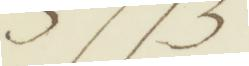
5773
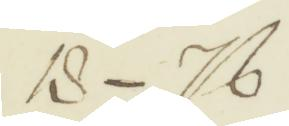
18 6/26 76
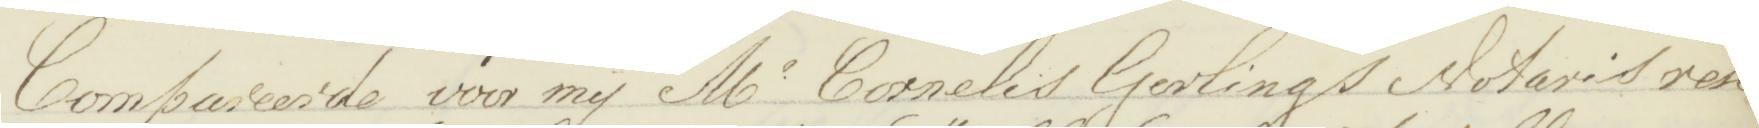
Compareerde voor mij M: Cornelis Gerlings Notaris resi
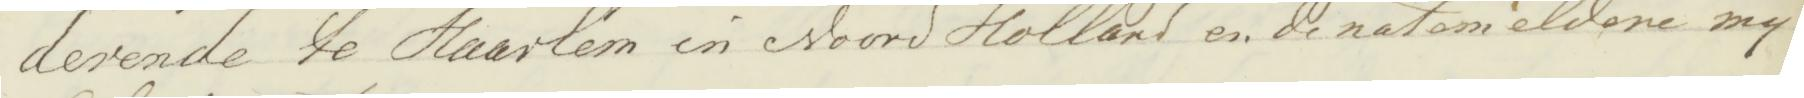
derende te Haarlem in Noord Holland en de na te meldene my
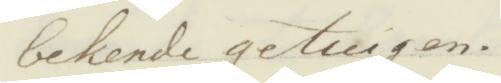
bekende getuigen.
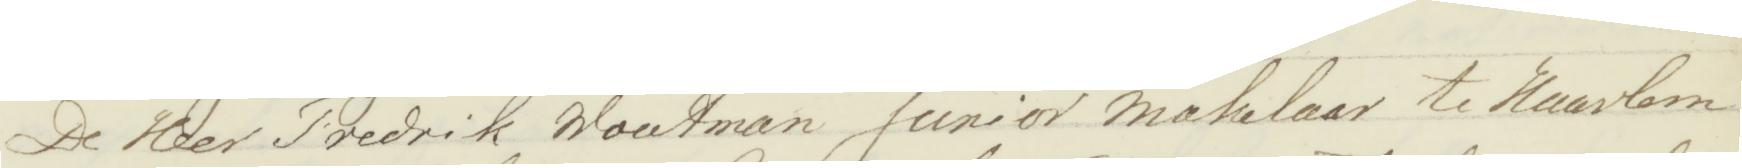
De Heer Fredrik Woutman Junior makelaar te Haarlem
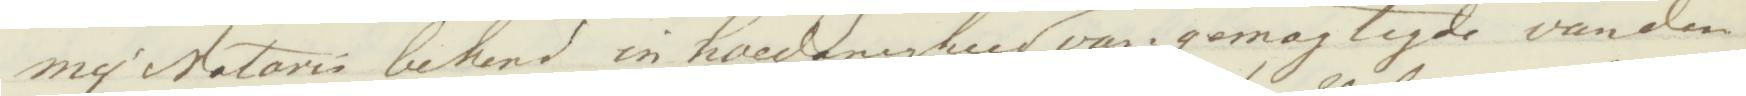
my Notaris bekend in hoedanigheid van gemagtigde van den
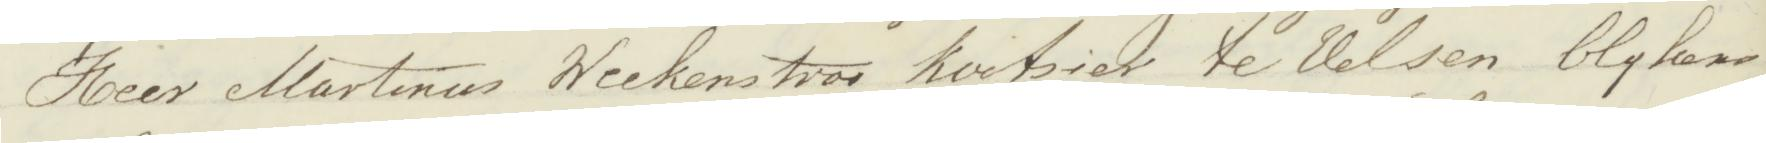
Heer Martinus Weekenstroo Koetsier te Velsen blykens
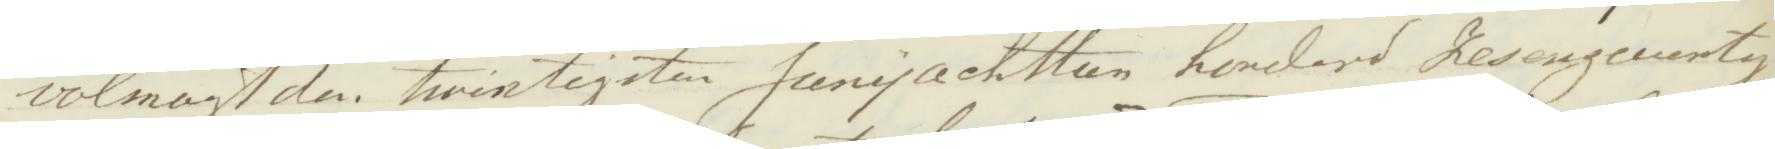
volmagt den twintigsten Junij achttien honderd Zesenzeventig
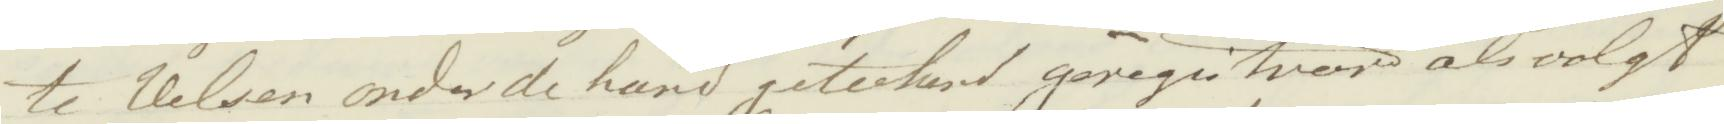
te Velsen onder de hand geteekend geregistreerd als volgt
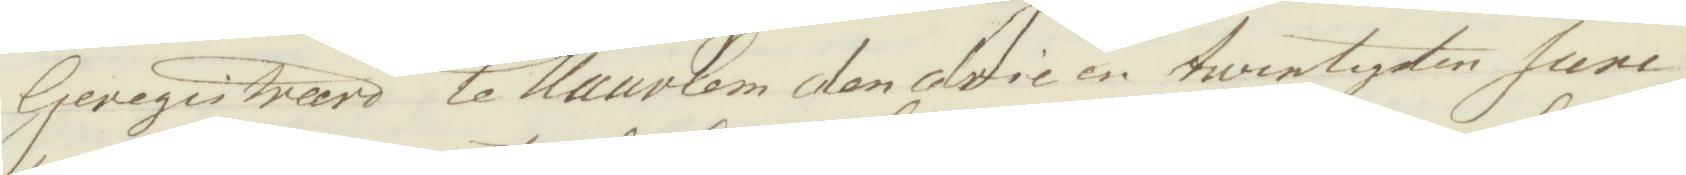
Geregistreerd te Haarlem den drie en twintigsten Juni
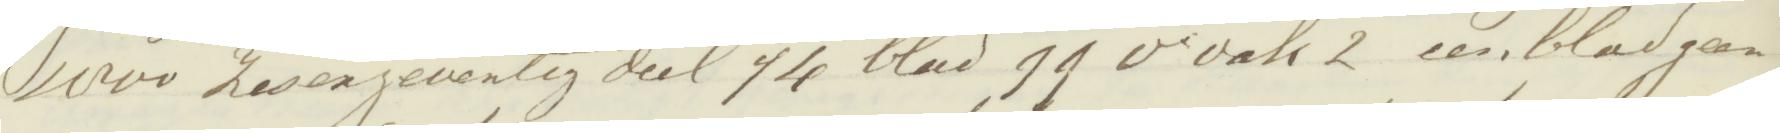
1800 Zesenzeventig deel 74 blad 99 v:o vak 2 een blad geen
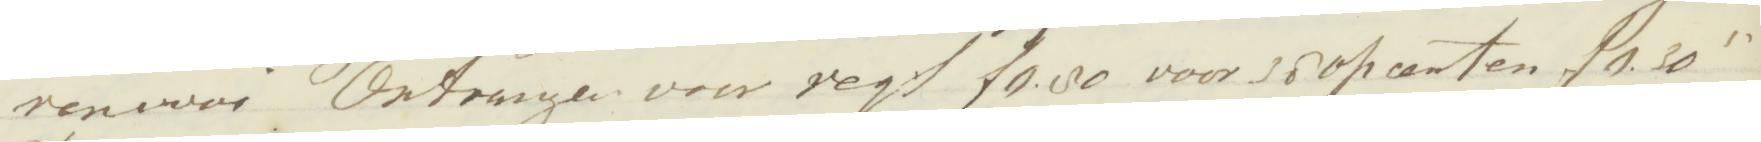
renvooi Ontvangen voor regt ƒ0.80 voor 38 op centen ƒ0.30
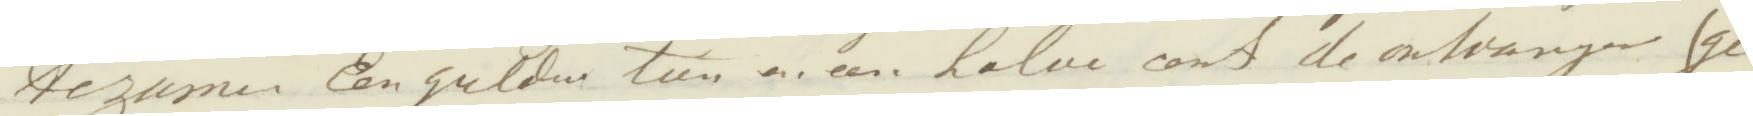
tezamen Een gulden tien en een halve cent de ontvanger (ge
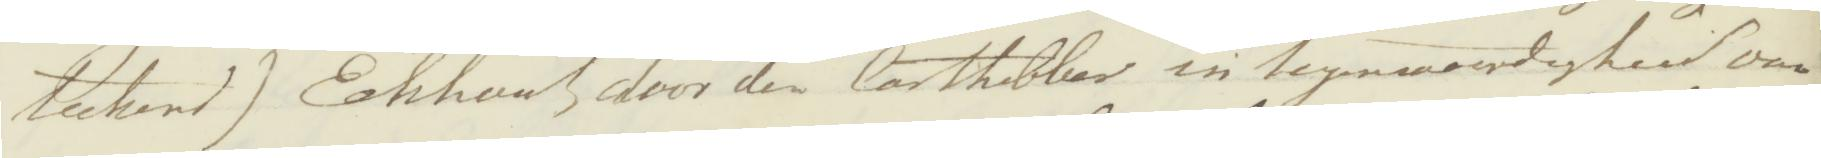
teekend) Eekhout door den Lasthebber in tegenwoordigheid van
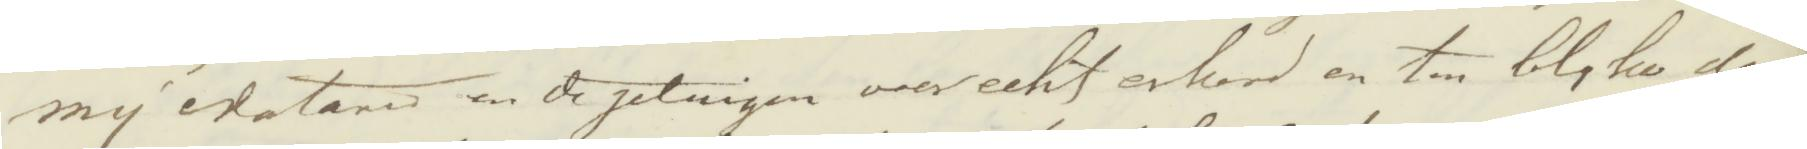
mij Notaris en de getuigen over echt erkend en ten blyke daar
